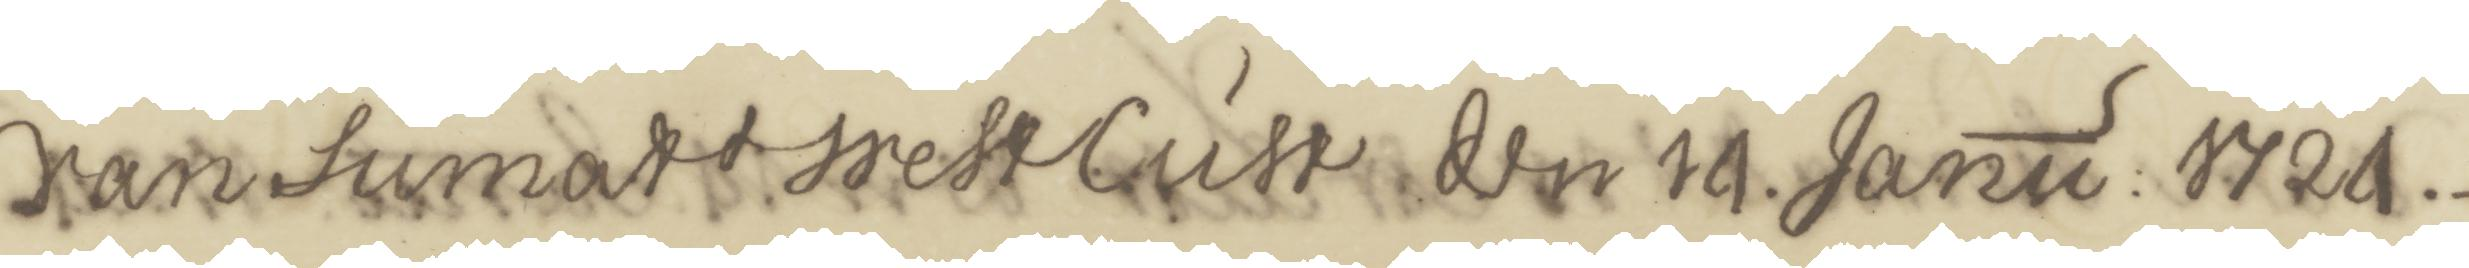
Van Sumats West Cust den 14. Janu: 1724.
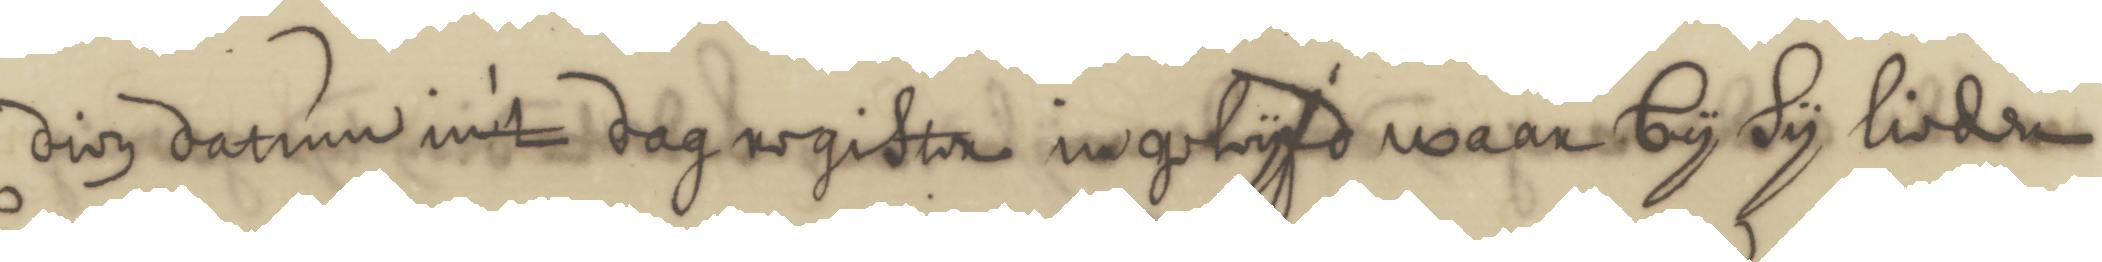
dien datum in't dag register ingelijfd waar bij sij lieden
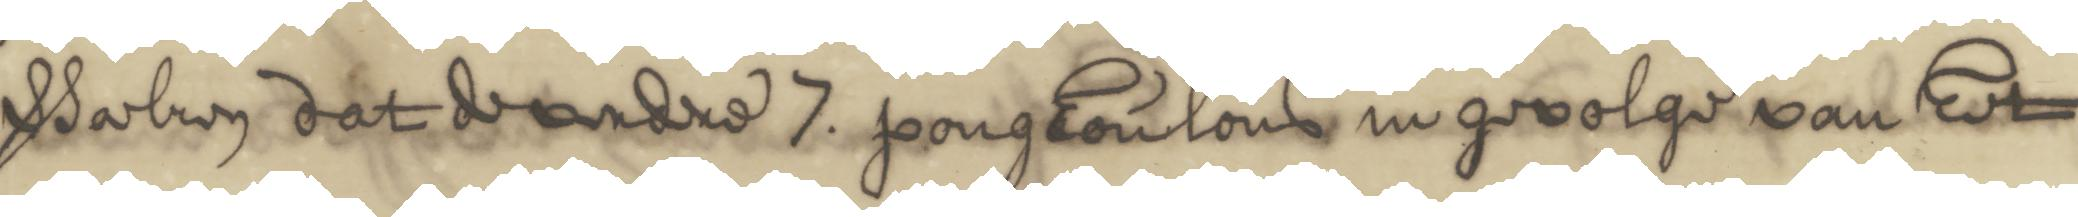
versoeken dat de andre 7. ponghoulous in gevolge van het
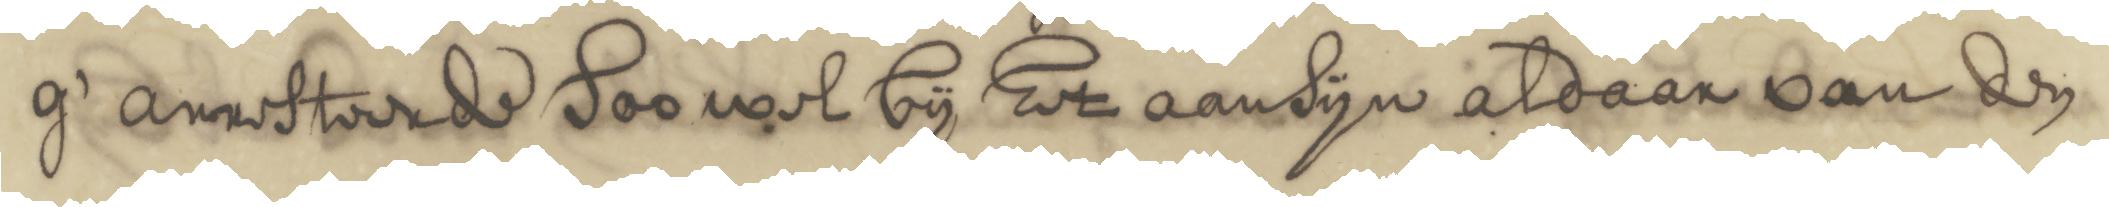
g’arresteerde soo wel bij het aansijn aldaar van den
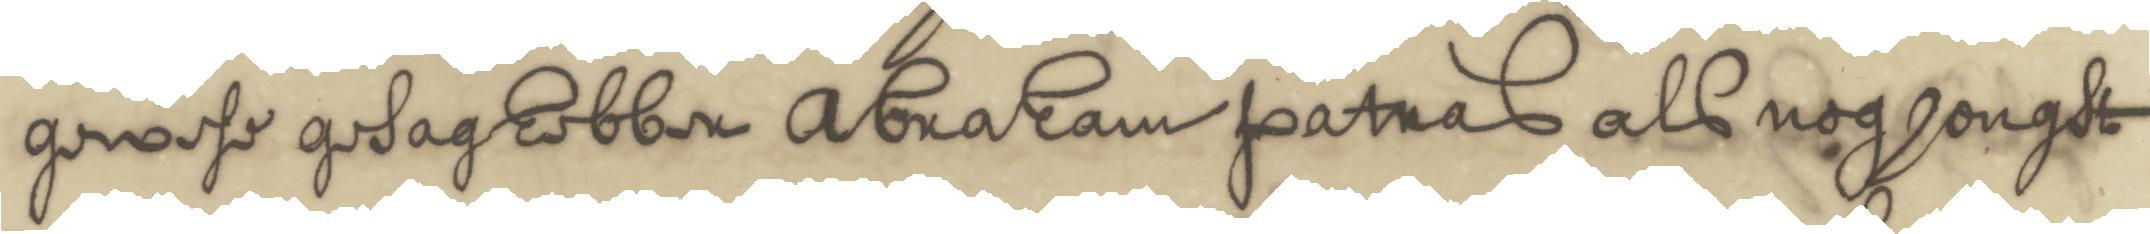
gewese gesaghebber Abraham Patras als nog jongst
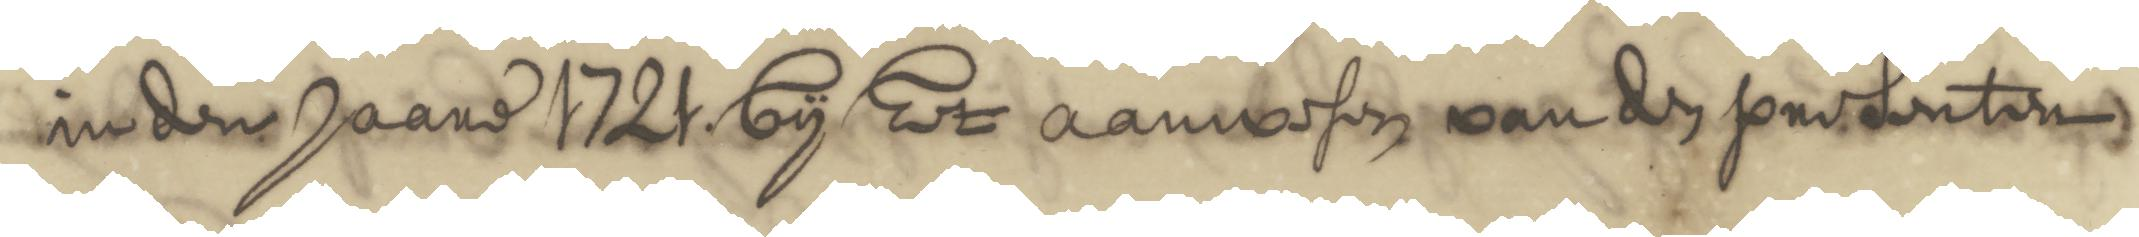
in den Jaare 1721. bij het aanwesen van den presenten
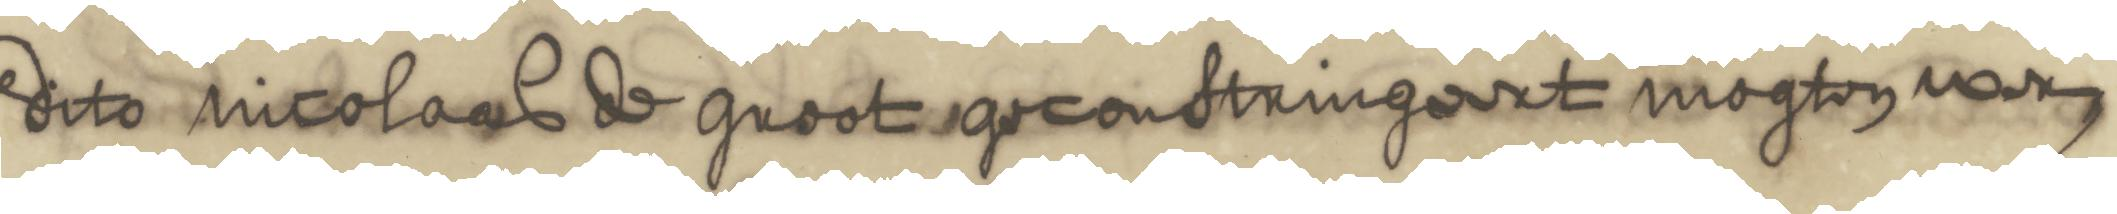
dito nicolaas de groot geconstringeert mogten wer
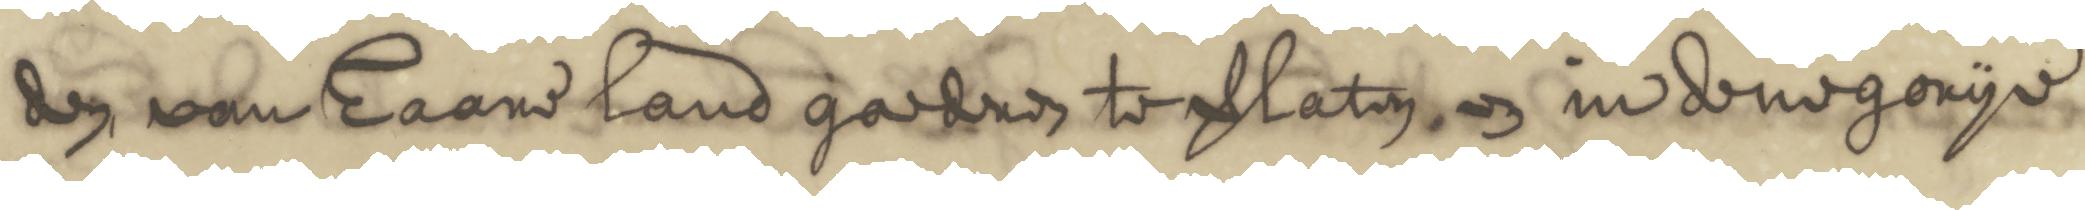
den, van haare land goedren te verlaten, en in de negorije
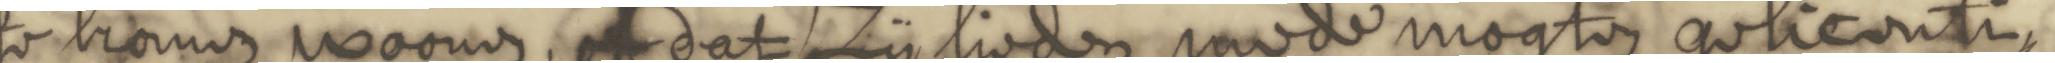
te komen woonen, of dat zij lieden mede mogten gelicenti„
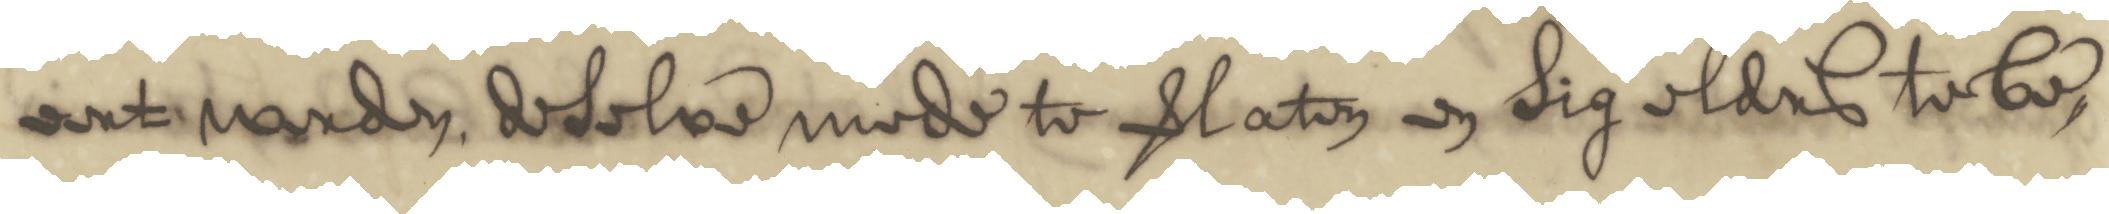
eert werden, deselve mede te verlaten en sig elders te be„
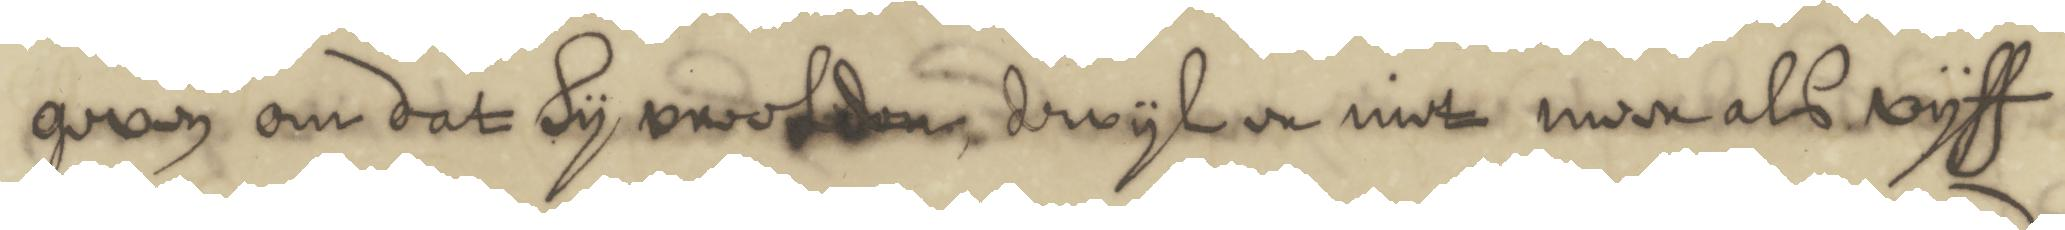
geven om dat sij vreesden dewijl er niet meer als vijff
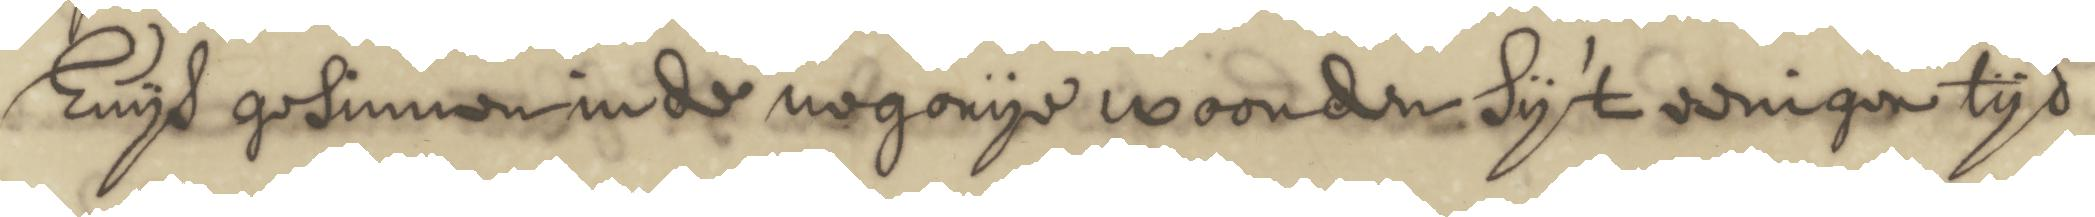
huijs gesinnen in de negorije woonden sij 't eeniger tijd
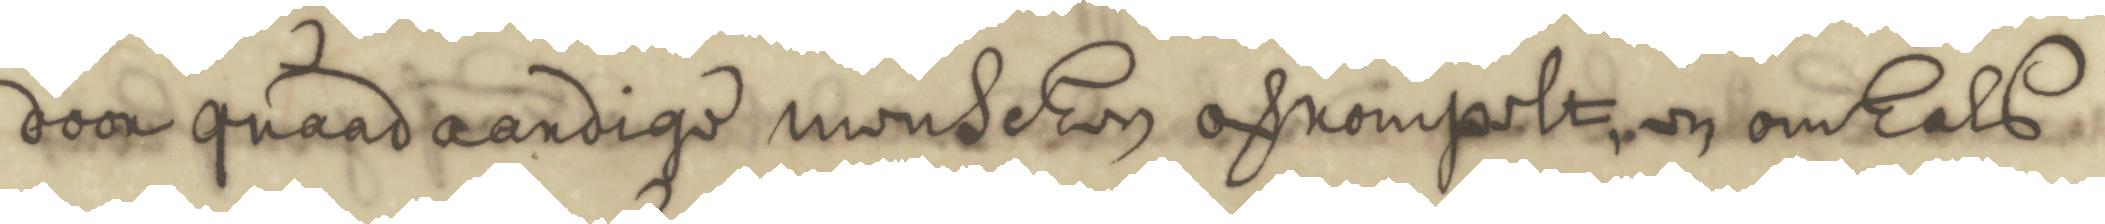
door quaad aardige menschen overrompelt, en omhals
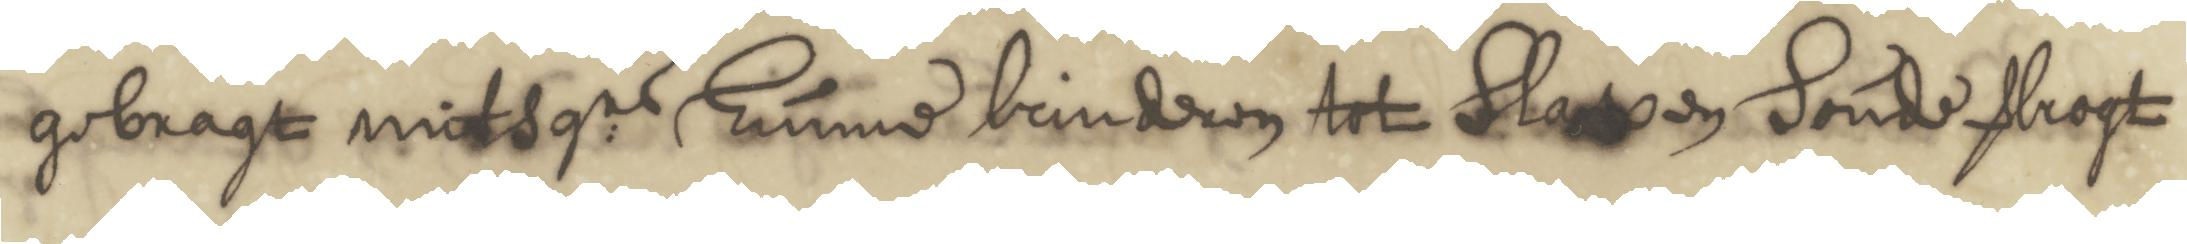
gebragt mitsg:rs hunne kinderen tot slaven soude verkogt
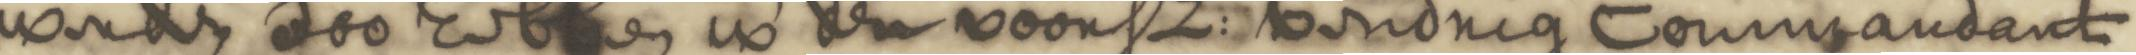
werden soo hebben w' den voorsz: vendrig commandant
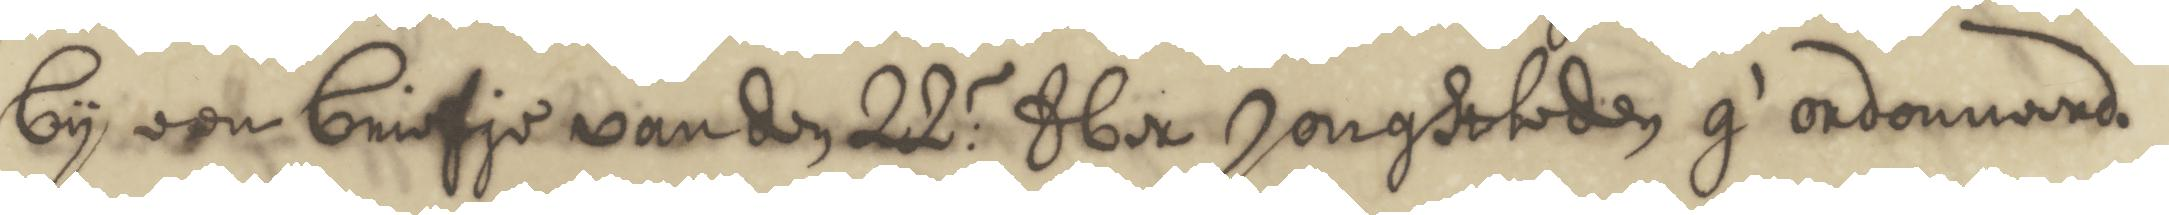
bij een briefje van den 22:' fbr jongstleden g’ordonneerd.
